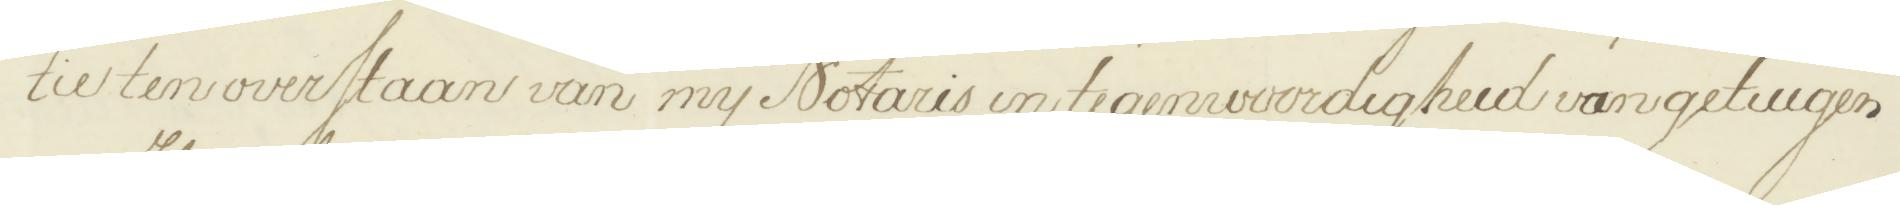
tie ten overstaan van my Notaris in tegenwoordigheid van getuigen
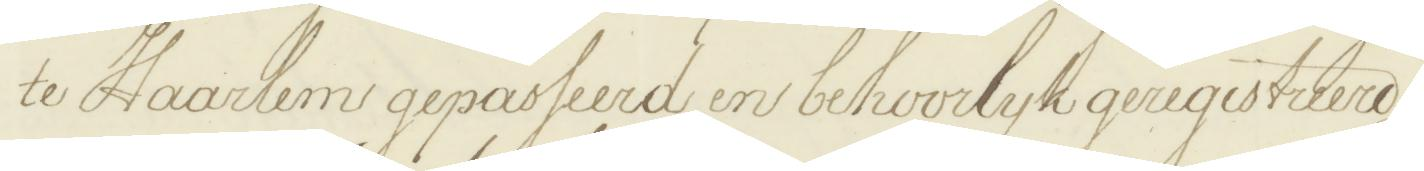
te Haarlem gepasseerd en behoorlyk geregistreerd.
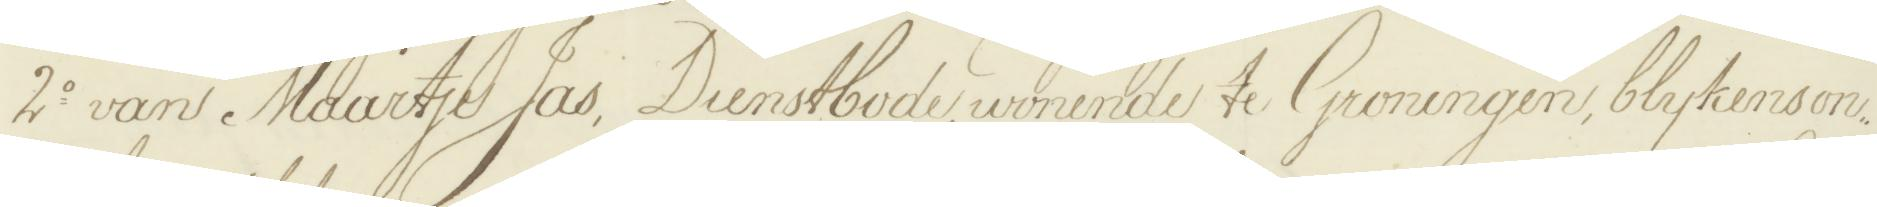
2=o van Maartje Jas, Dienstbode, wonende te Groningen, blykens on„
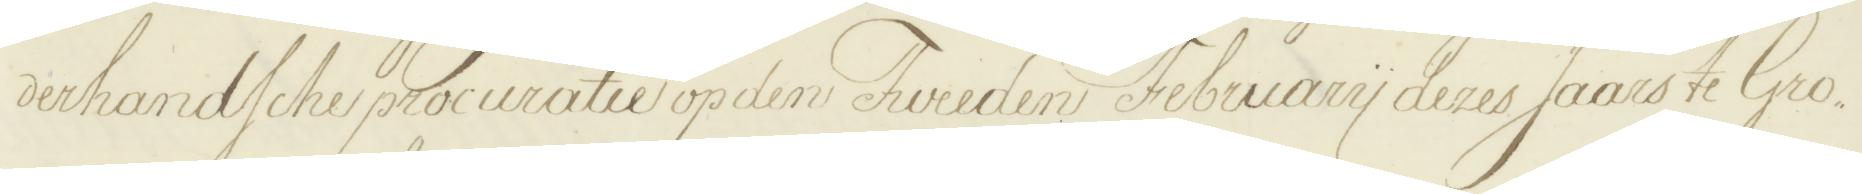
derhandsche procuratie op den Tweeden Februarij dezes Jaars te Gro„
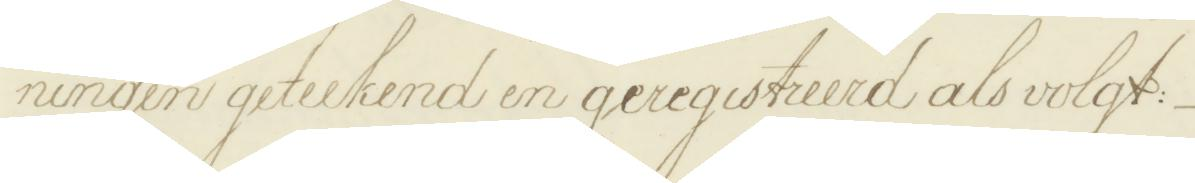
ningen geteekend en geregistreerd als volgt:
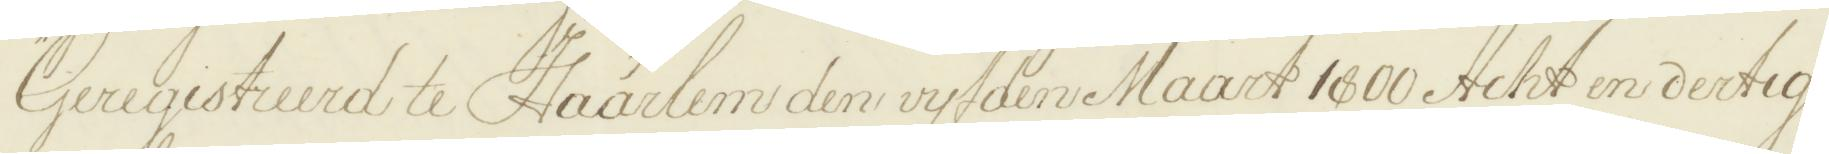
”Geregistreerd te Haarlem den vyfden Maart 1800 Acht en dertig,
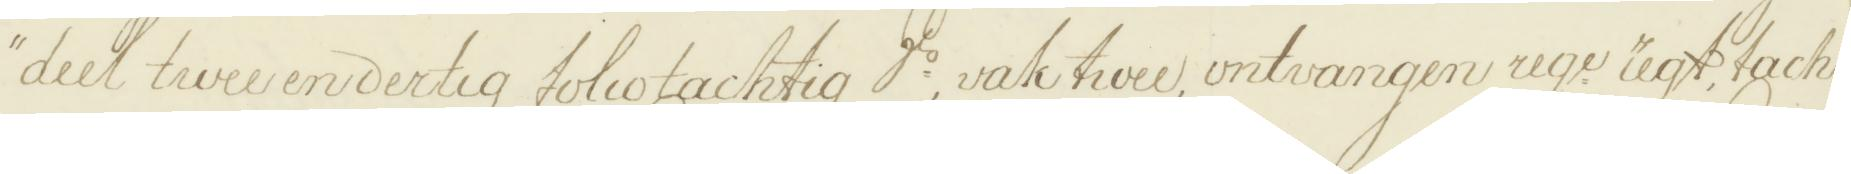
”deel twee en dertig, folio tachtig V=o, vak twee, ontvangen reg=e regt, tach
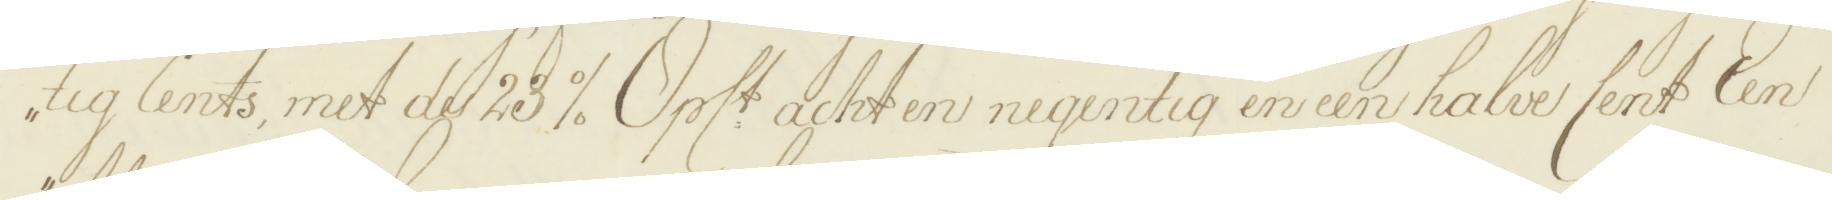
”„tig Cents, met de 23%. OpC=t acht en negentig en een halve Cent Een
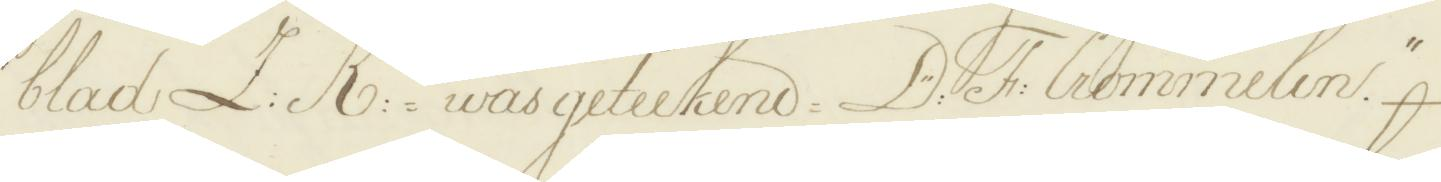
”blad Z: R:=was geteekend: D:F: Crommelin.”
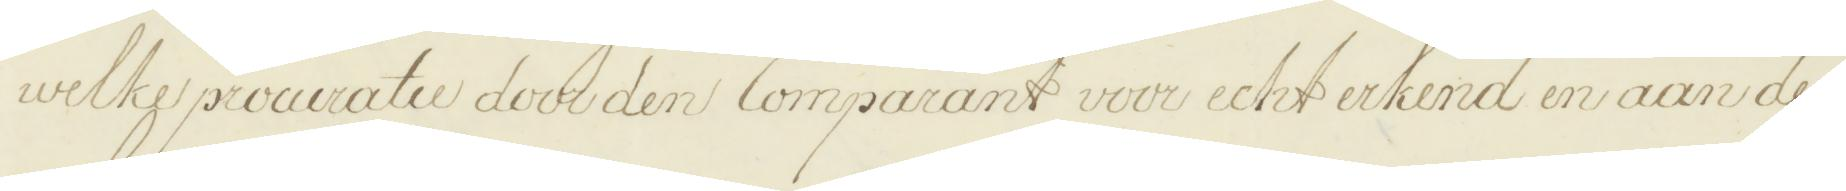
welke procuratie door den Comparant voor echt erkend en aan de
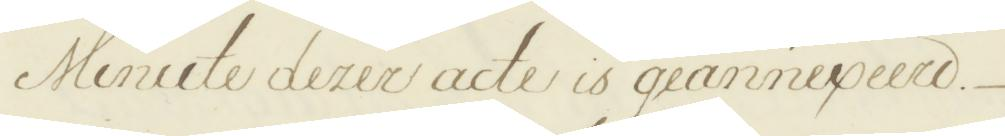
Minute dezer acte is geannexeerd.
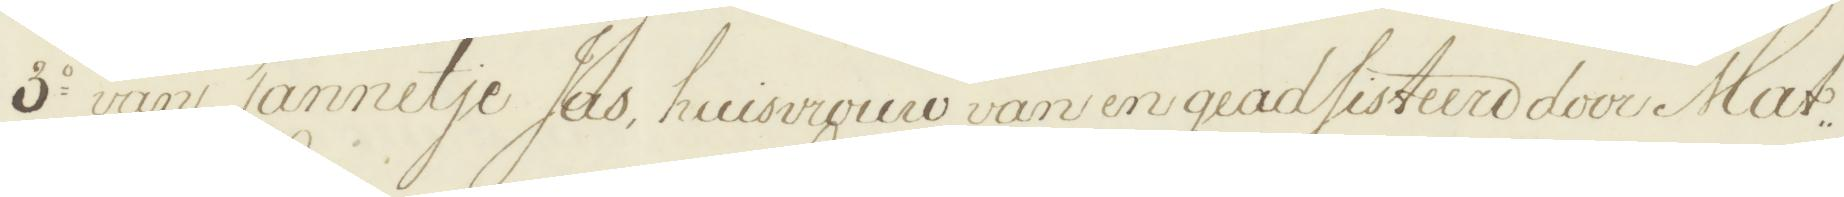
3=o van Jannetje Jas, huisvrouw van en geadsisteerd door Mat„
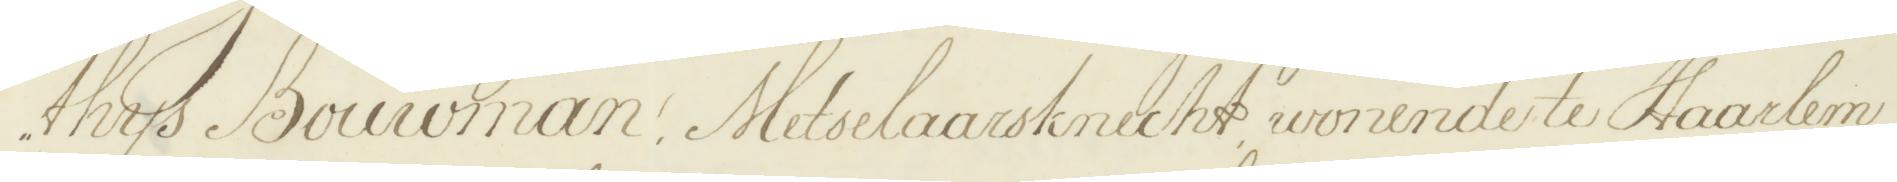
„thys Bouwman, Metselaarsknecht wonende te Haarlem,
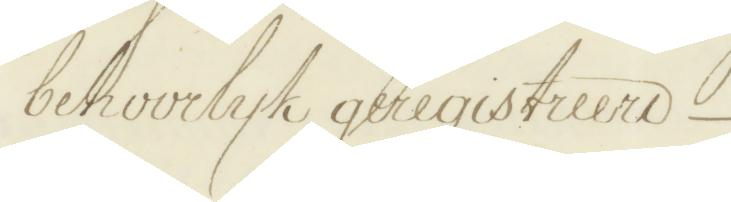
behoorlyk geregistreerd
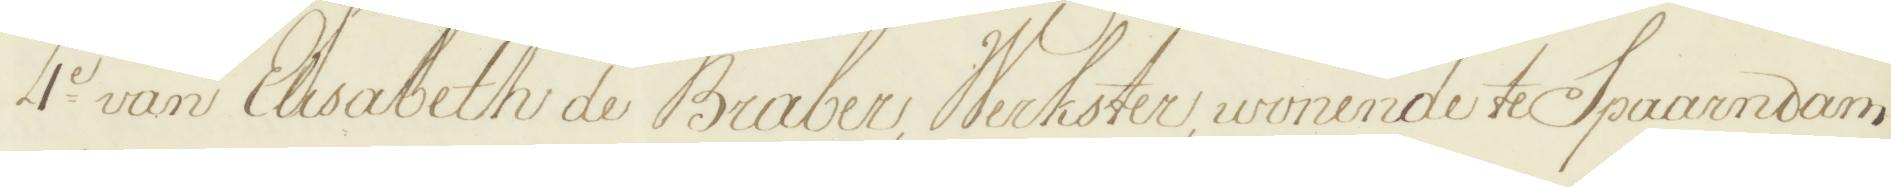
4=e van Elisabeth de Braber, Werkster, wonende te Spaarndam
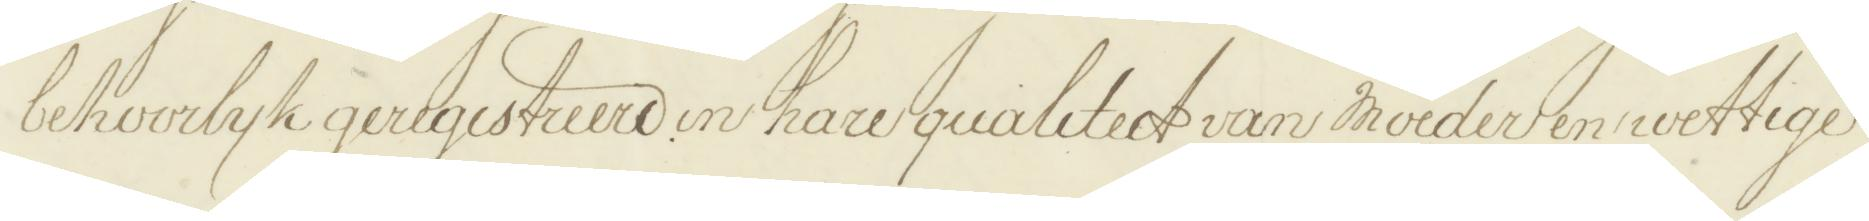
behoorlyk geregistreerd in hare qualiteit van moeder en wettige
